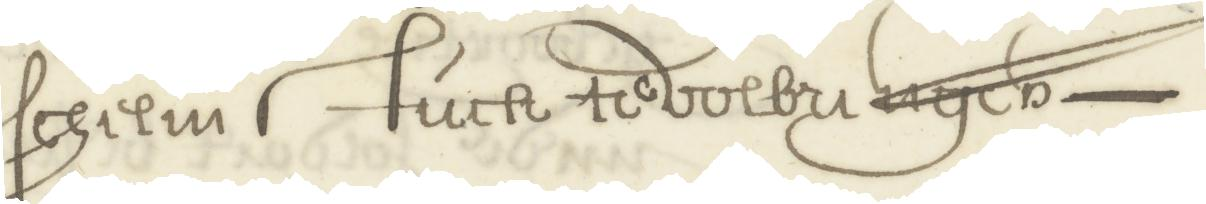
schelm stuck te volbrengen —
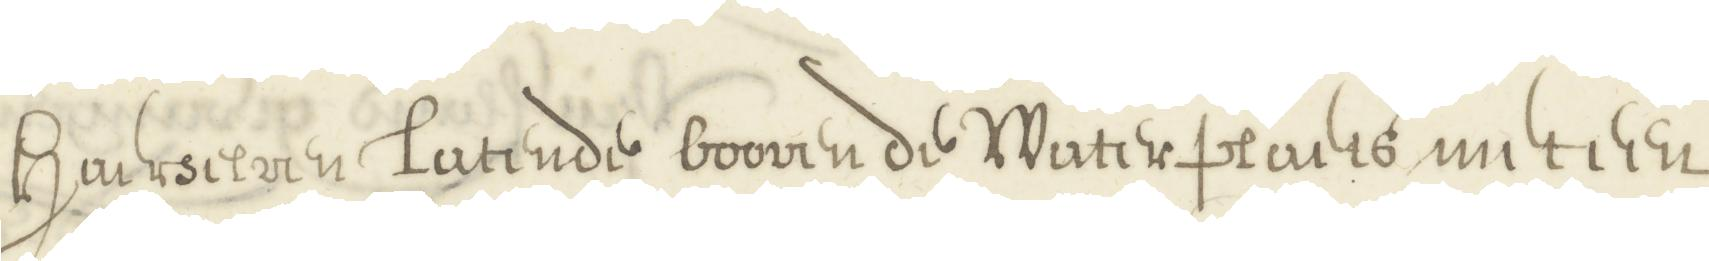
Haer selven latende booven de Waterplaets met een
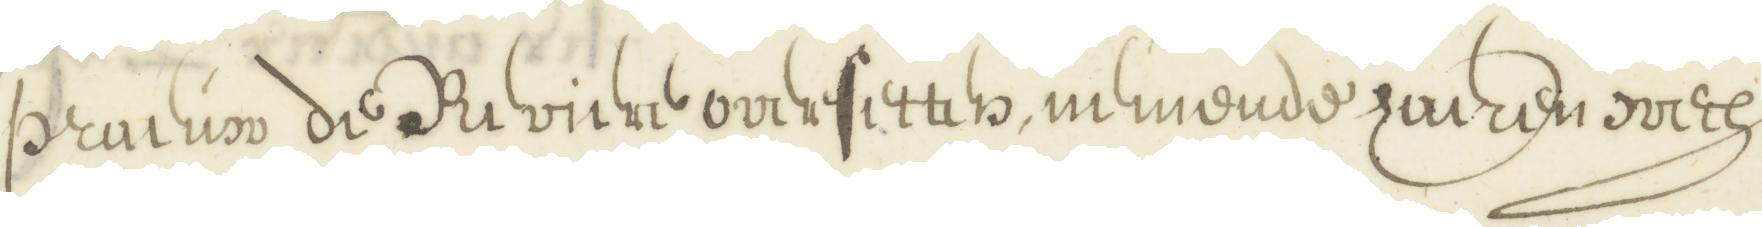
praeuw de Reviere oversetten, nemende haeren wech
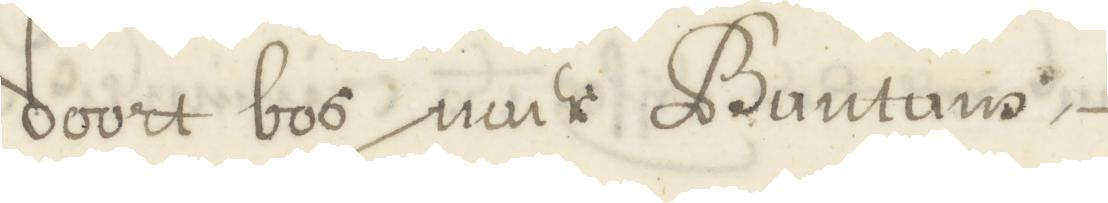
doort bos naer Bantam,-
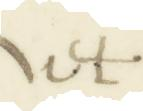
vet
